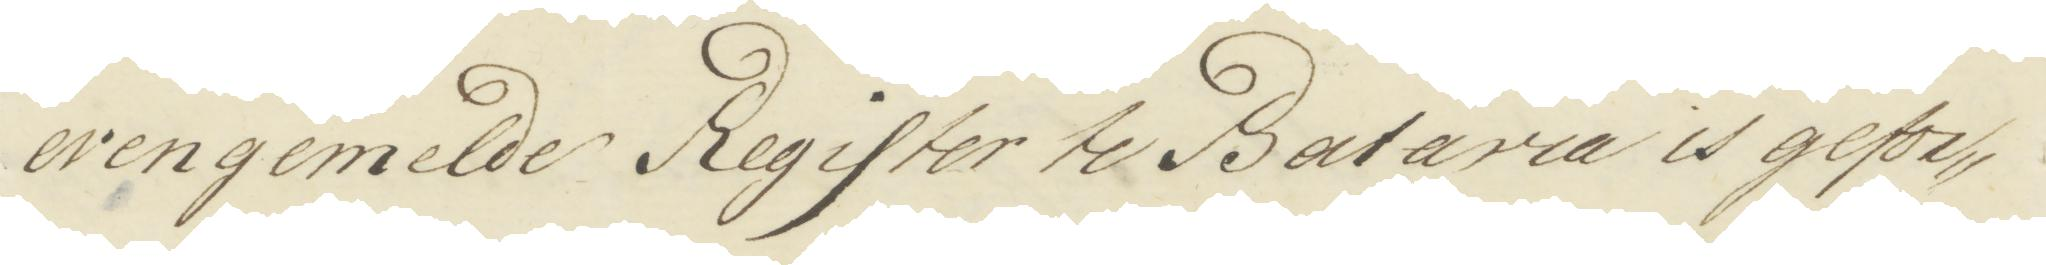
even gemelde Register te Batavia is gefor„
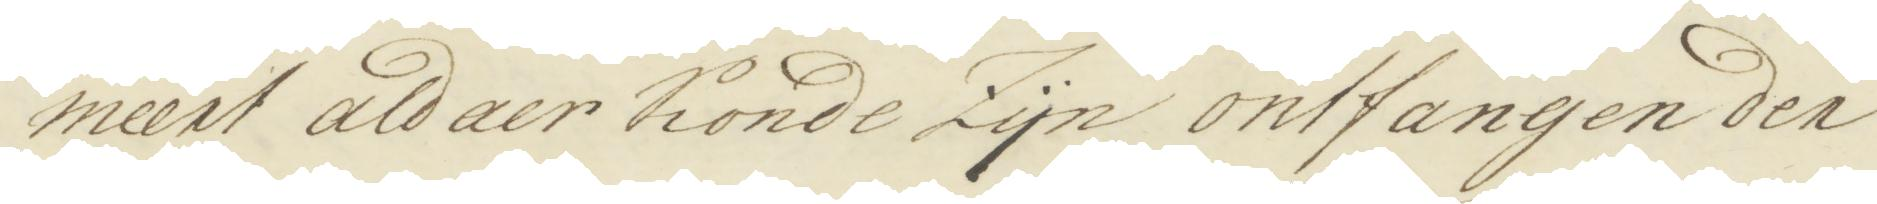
meert aldaer konde zijn ontfangen der
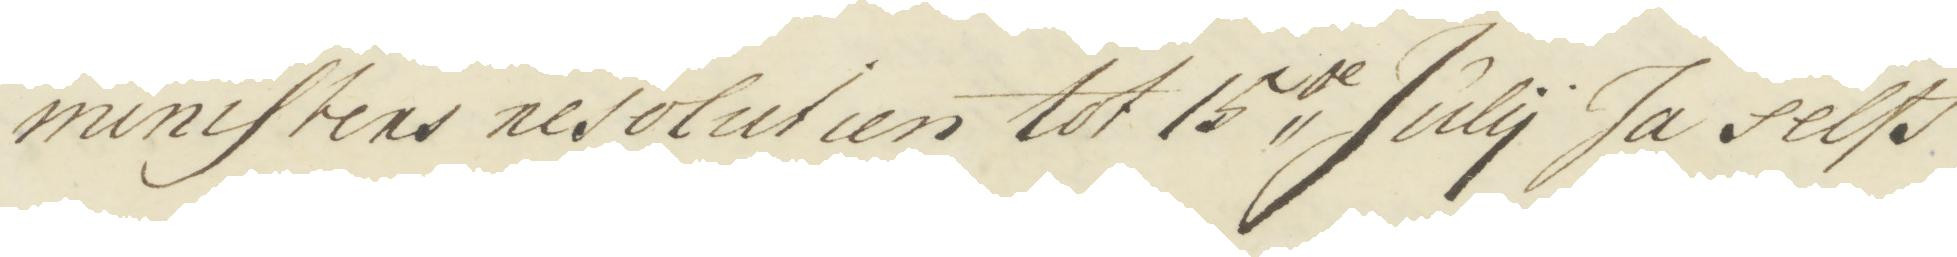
ministers resolutien tot 15„de Julij ja selfs
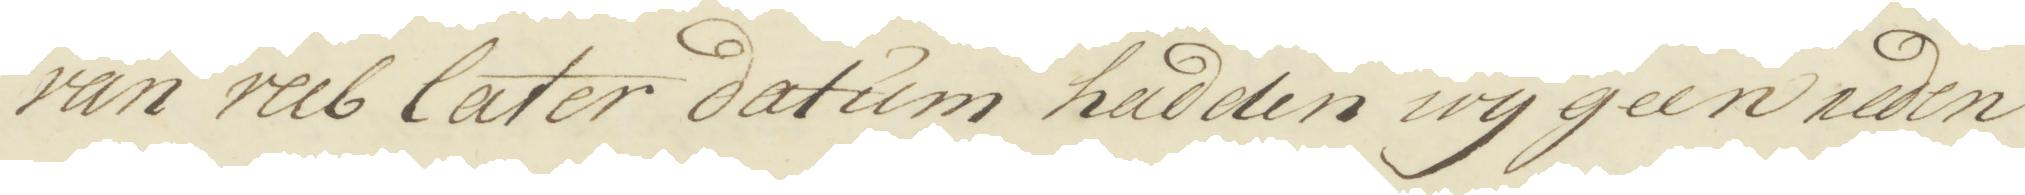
van veel later datum hadden wij geen reden
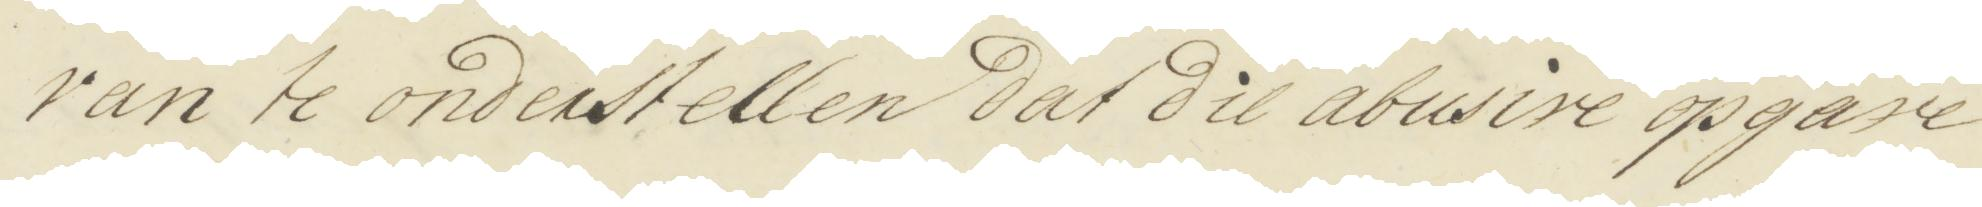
van te onderstellen dat die abusive opgave
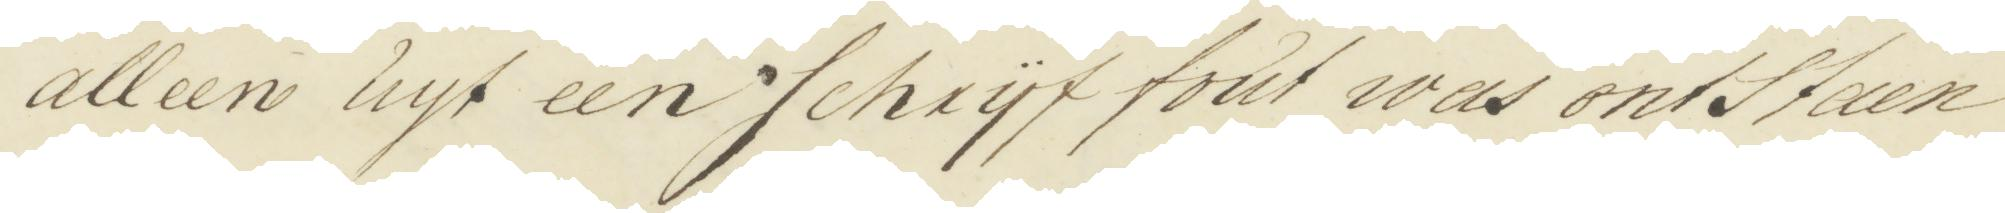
alleen uyt een schrijf fout was ontstaen
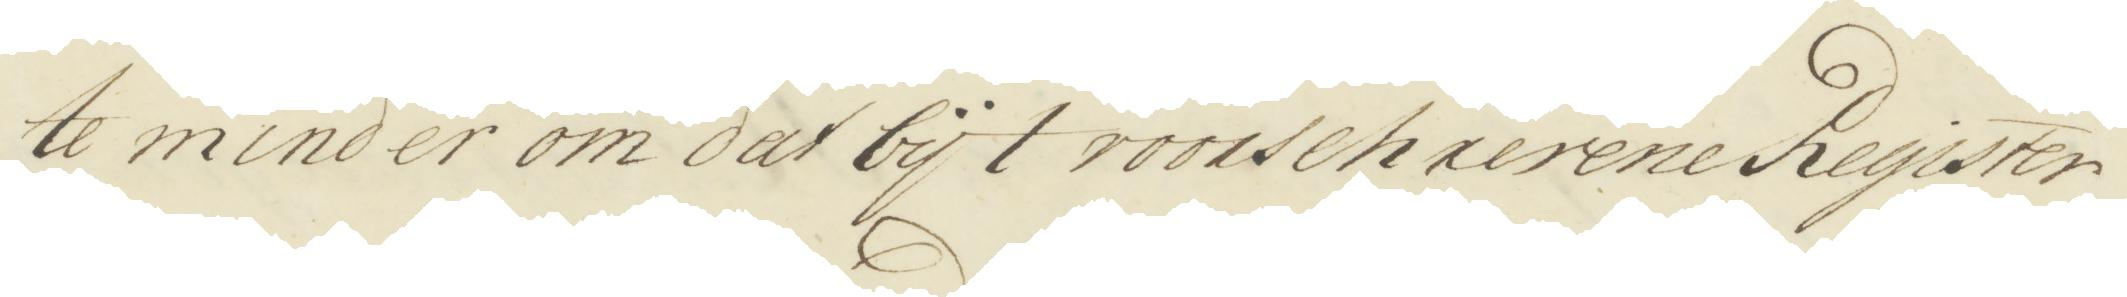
te minder om dat bij t voorschrevene Register
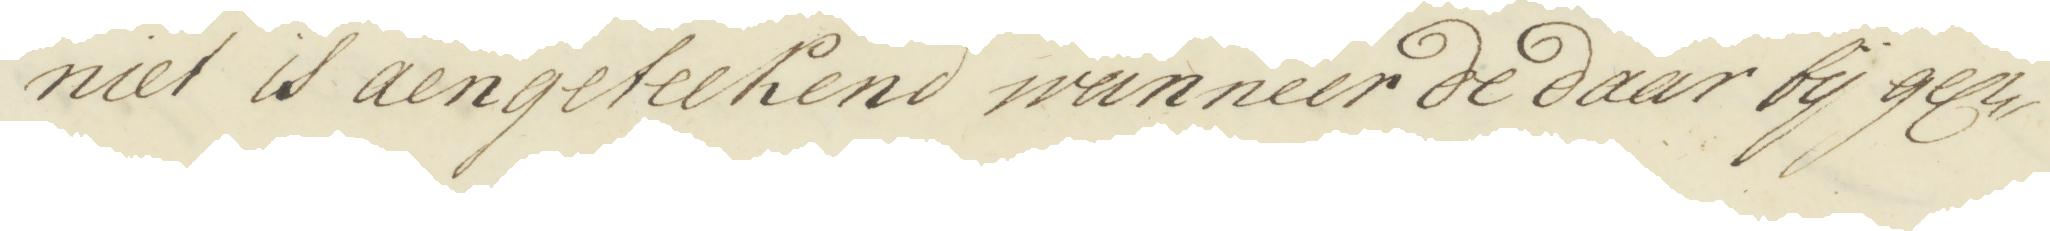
niet is aengeteekend wanneer de daar bij geci„
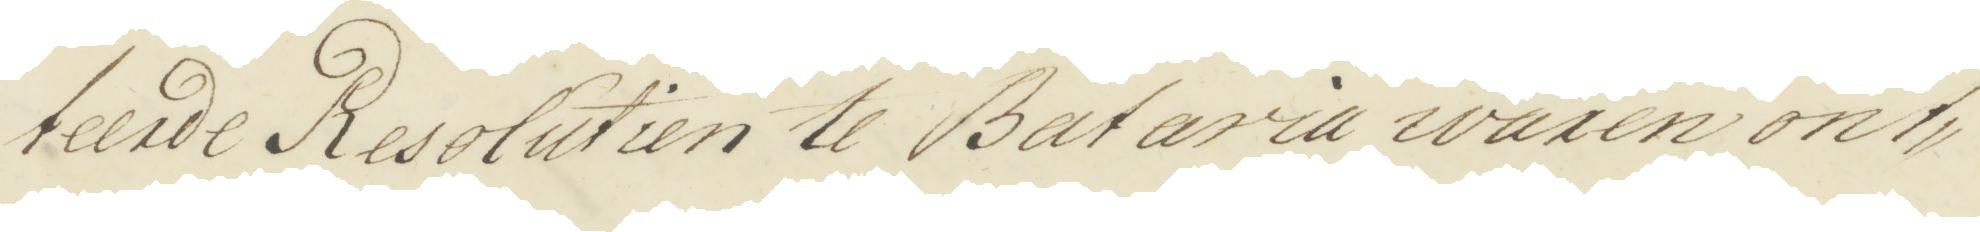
teerde Resolutien te Batavia waren ont„
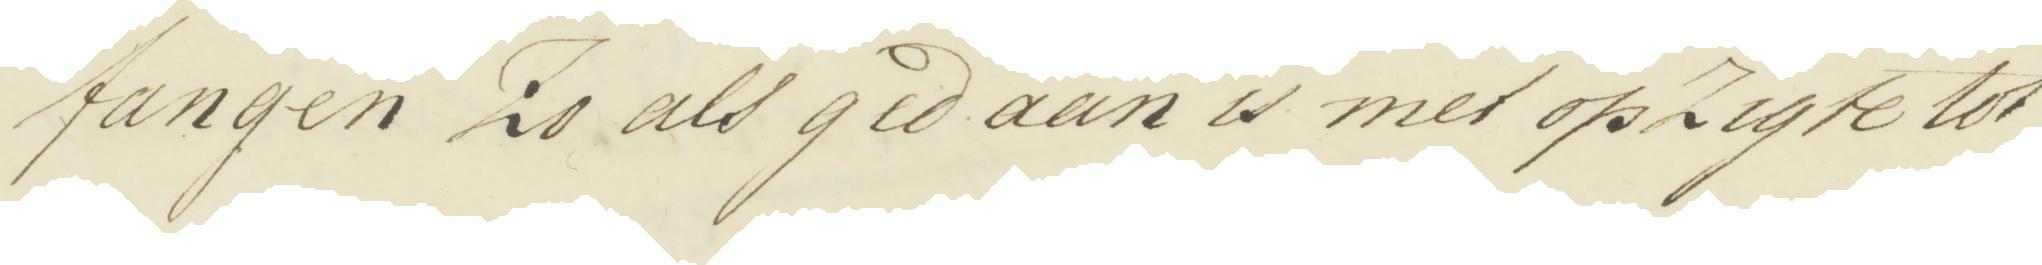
fangen zo als gedaan is met opzigte tot
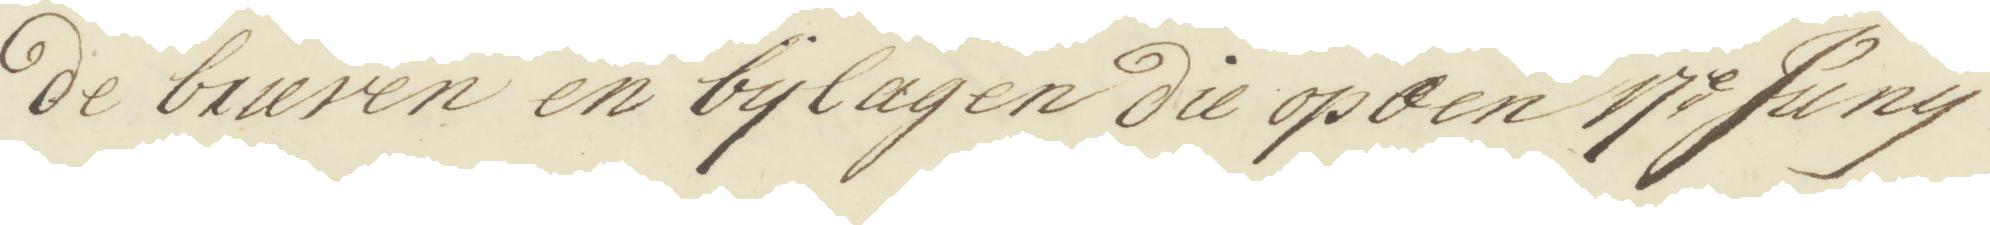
de brieven en bijlagen die op den 17=e Junij
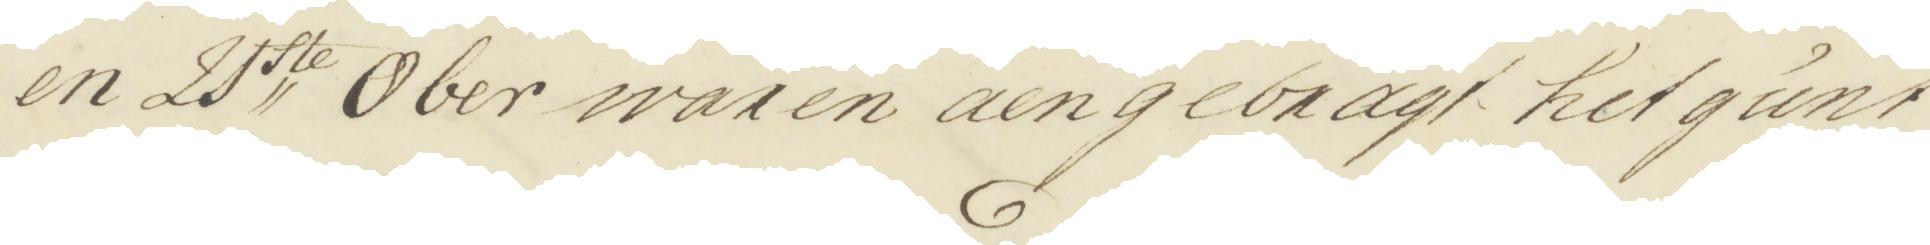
en 21„ste 8ber waren aen gebragt het gunt
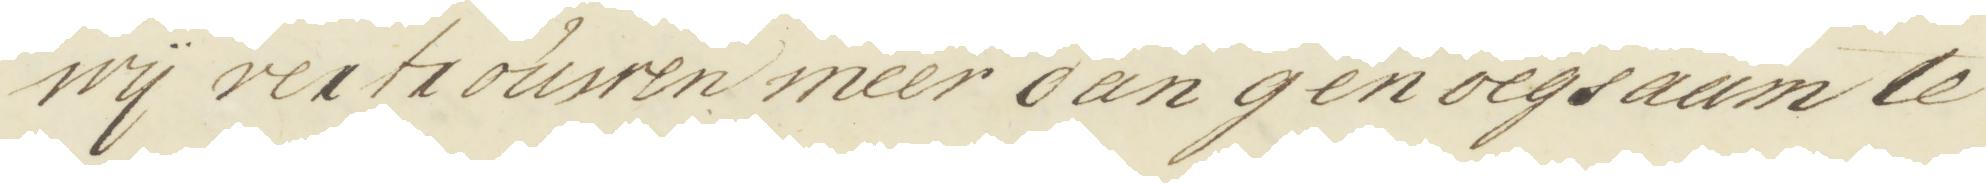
wij vertrouwen meer dan genoegsaam te
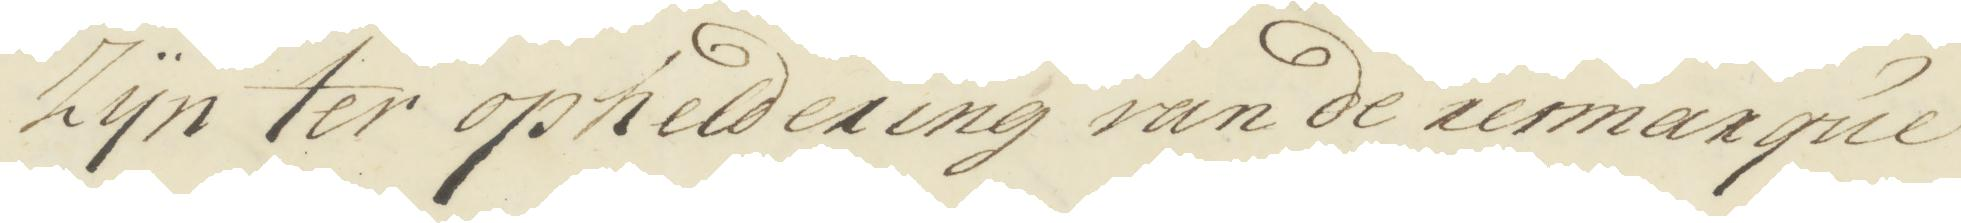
zijn ter opheldering van de rermarque
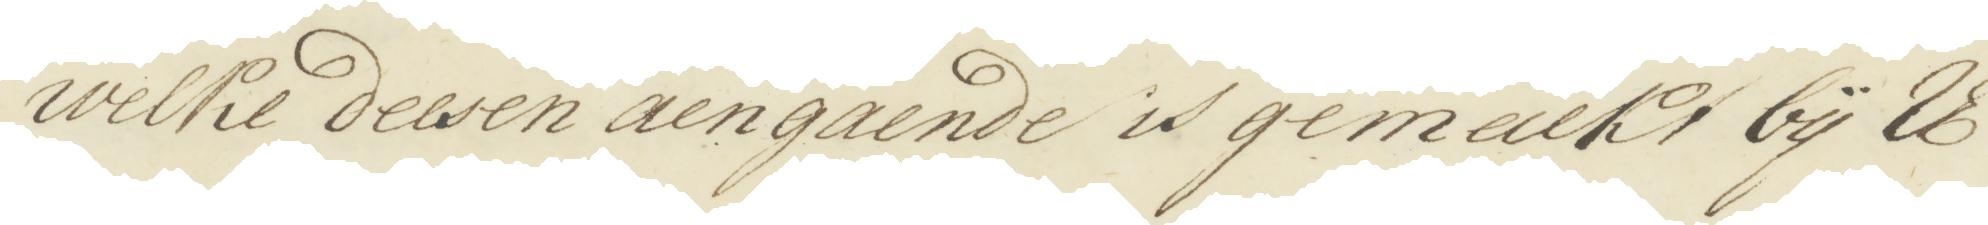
welke deesen aengaende is gemaekt bij UE
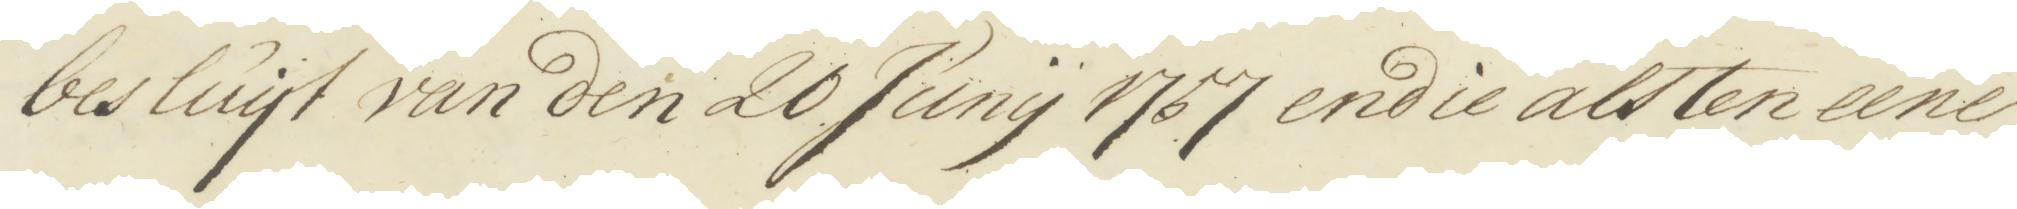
besluijt van den 20 Junij 1757 en die als ten eene
